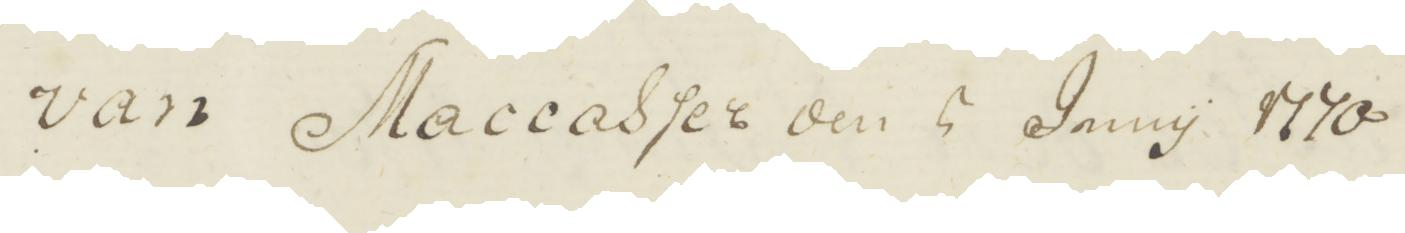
van Maccasser den 5 Iunij 1770
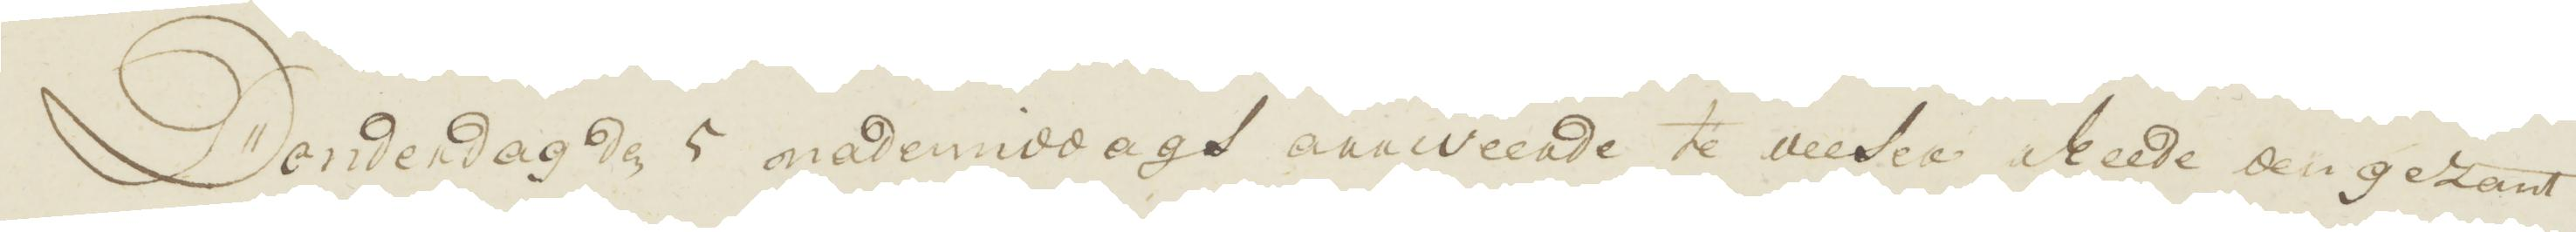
Donderdag den 5 nademiddags arriveerde te deeser rheede den gezant
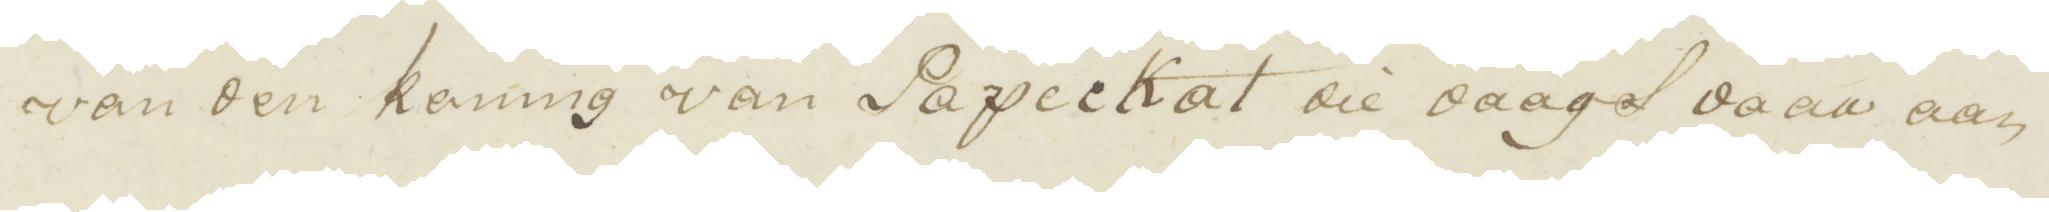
van den koning van Papeckat die daags daar aan
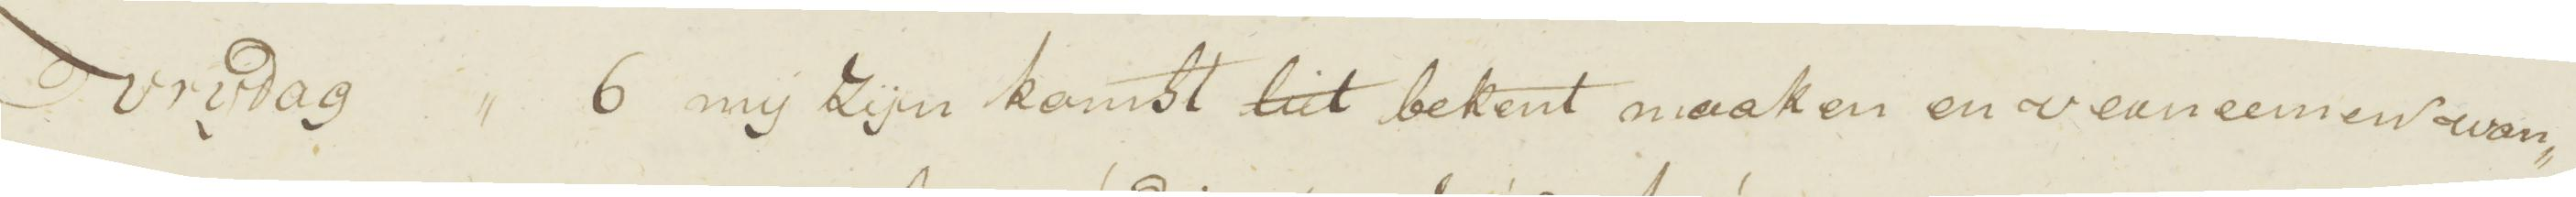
Vrydag „ 6 mij zijn komst liet bekent maaken en verneemen wan„
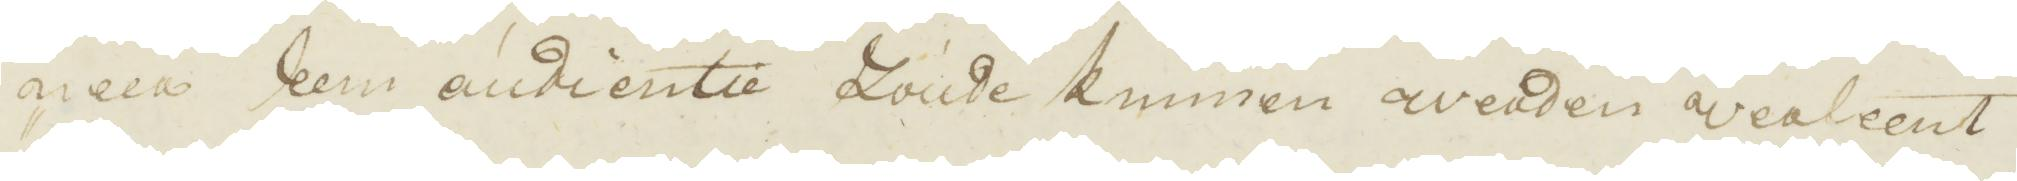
„neer hem audientie zoude kunnen werden verleent
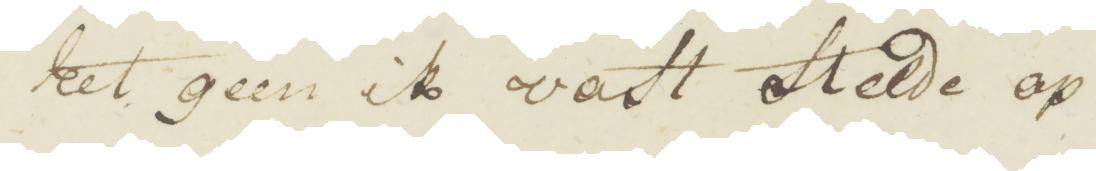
het geen ik vast stelde op
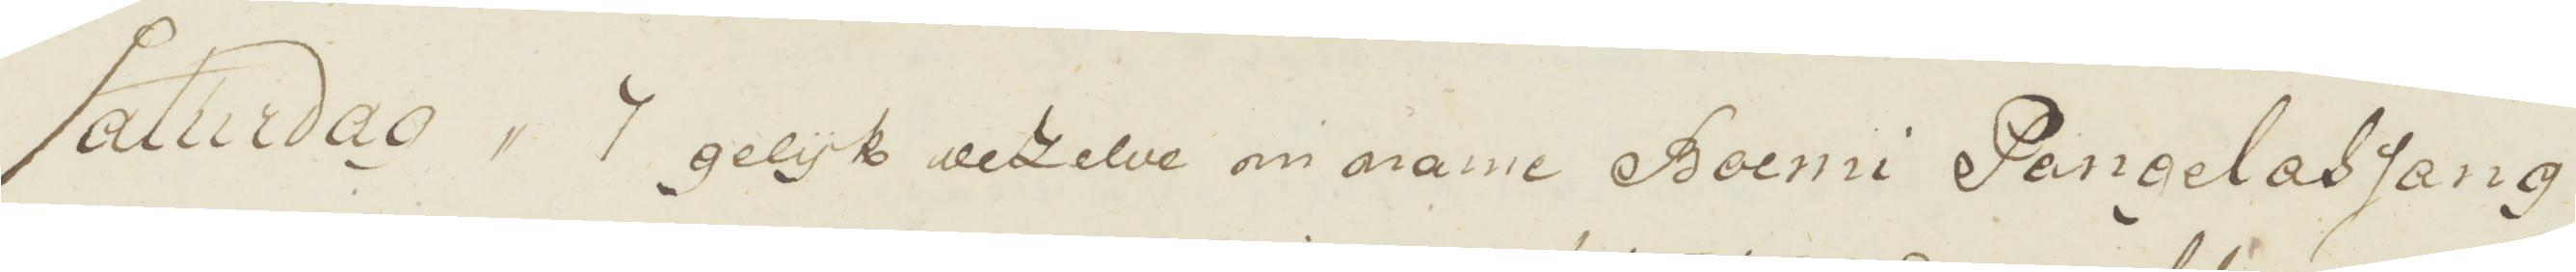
Saturdag „ 7 gelijk dezelve in name Boemi Pangelas Jang
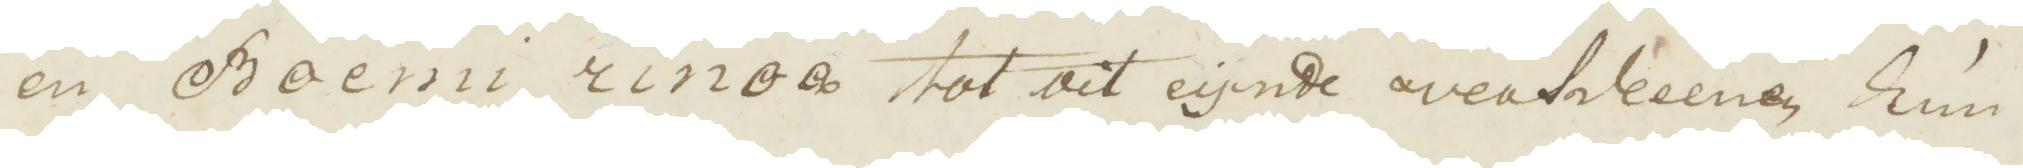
en Boemi rinoa tot dit eijnde verscheenen hun
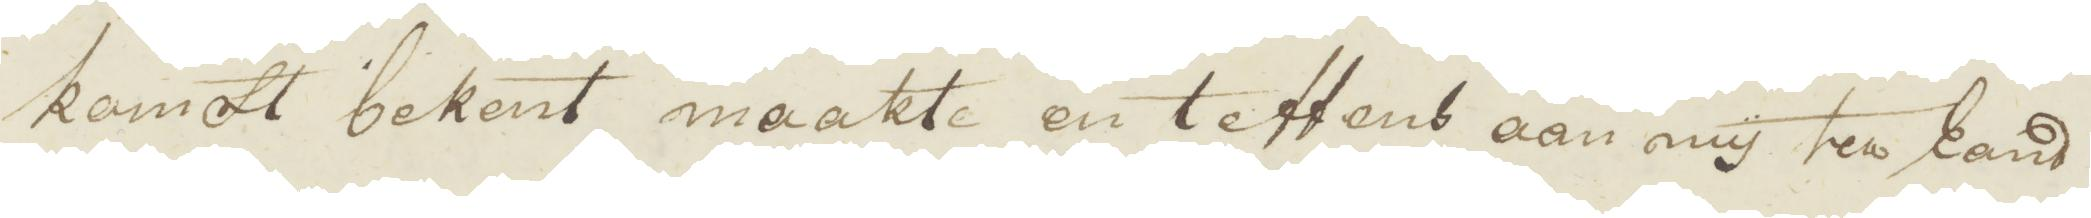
komst bekent maakte en teffens aan wij ter hand
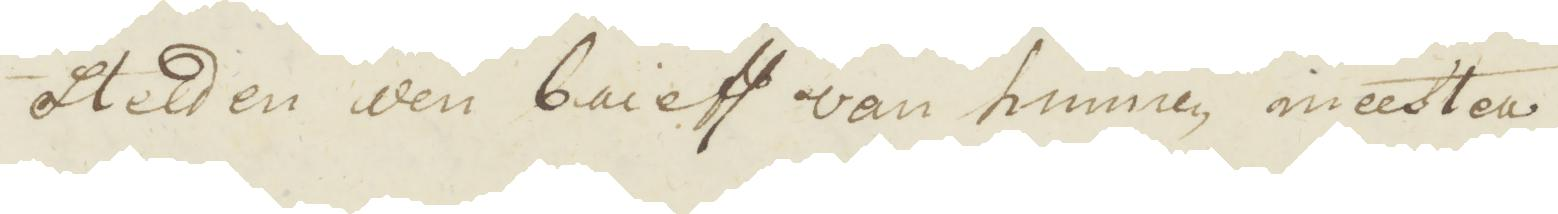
stelden een brieff van hunnen meester.
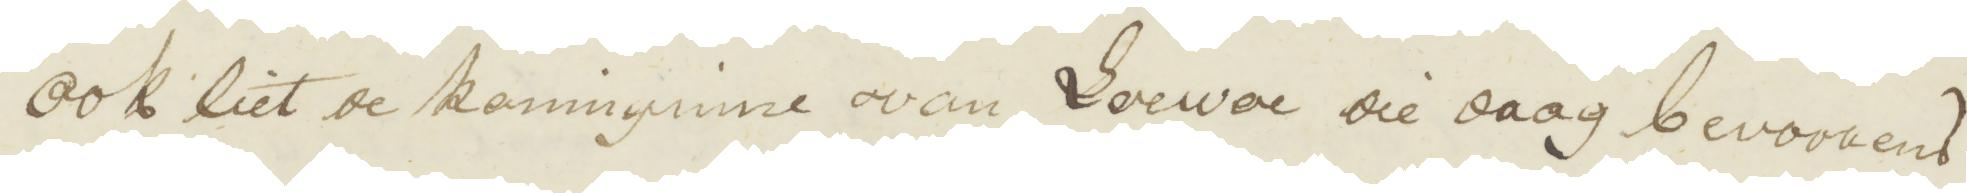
Ook liet de koninginne van Loewoe die daag bevoorens
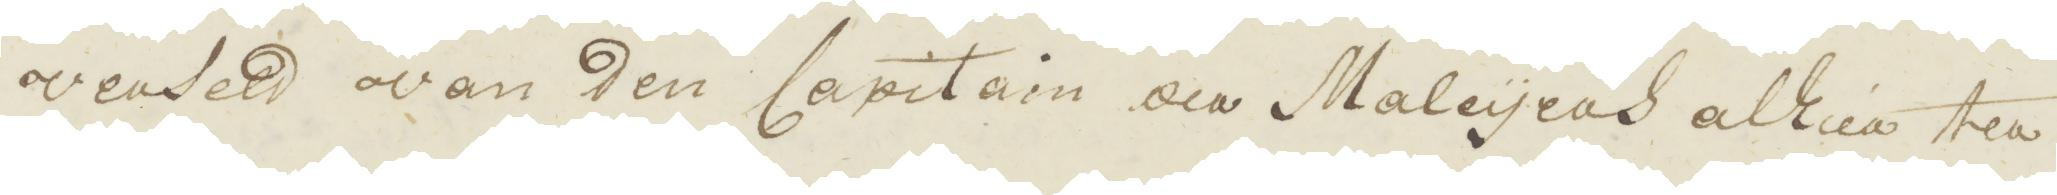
verseld van den Capitain der Maleijers alhier ter
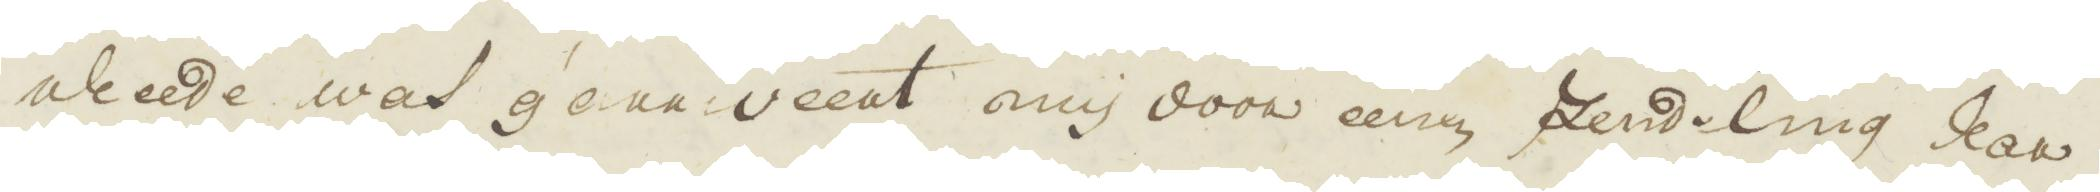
rheede was g'arriveert mij door eenen zendeling har
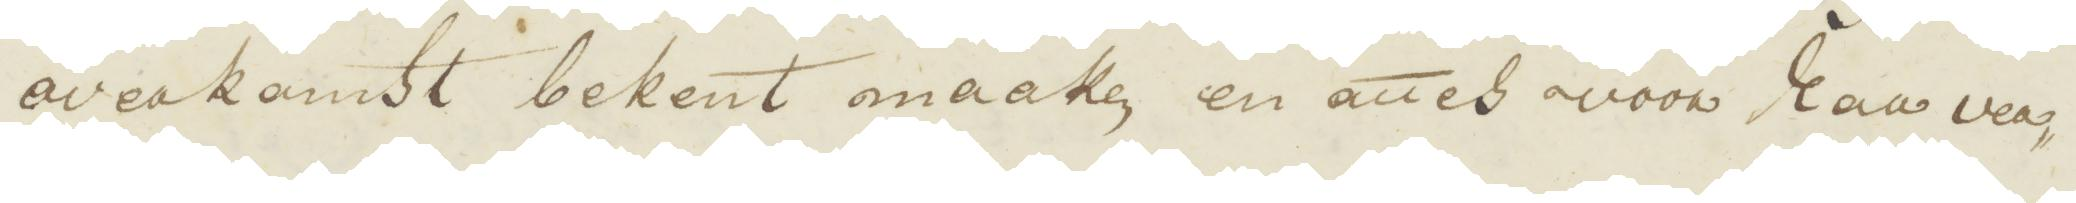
overkomst bekent maaken en aues voor har ver„
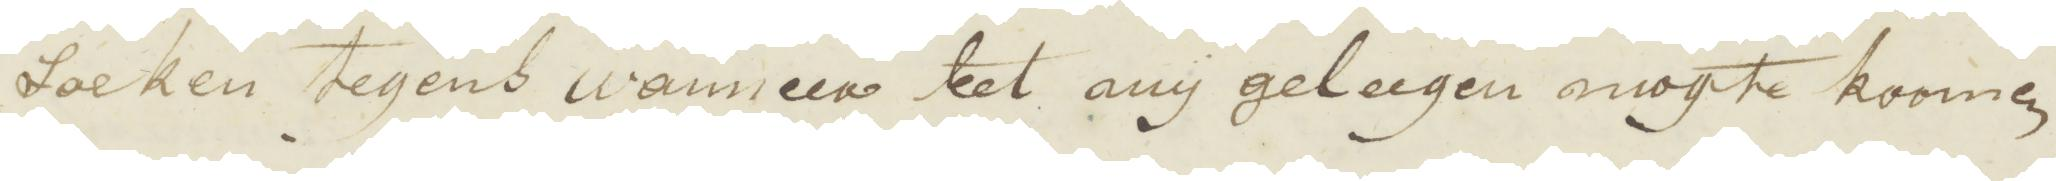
soeken tegens wanneer het mij geleegen mogte koomen
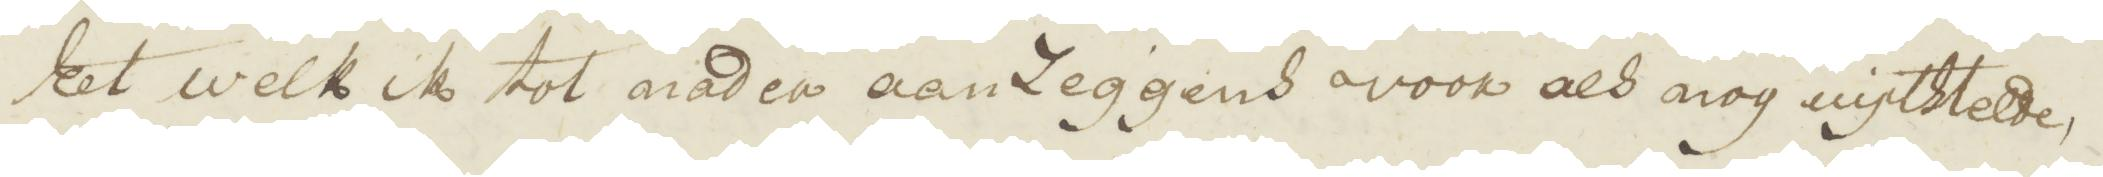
het welk ik tot nader aanzeggens voor als nog uijtstelde,
